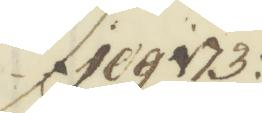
ƒ109173
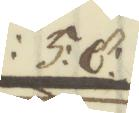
5:8:
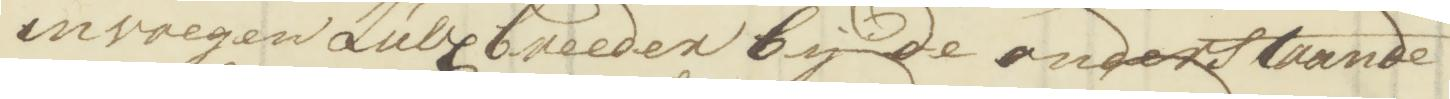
invoegen zulx breeder bij de onderstaande
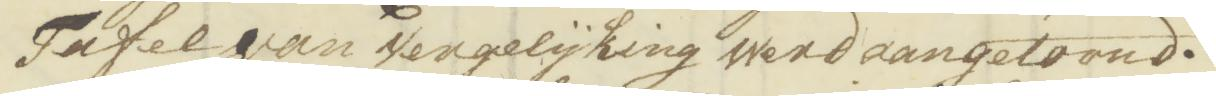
Tafel van vergelijking werd aangetoond.
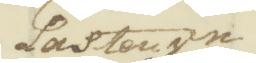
Lasten v=n
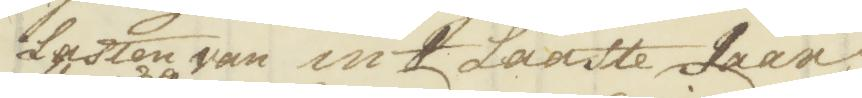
Lasten van in t Laaste Jaar
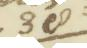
38/39
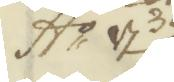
A„o 1739/40
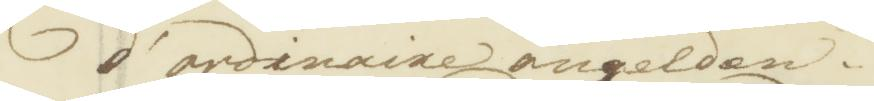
d'ordinaire ongelden -
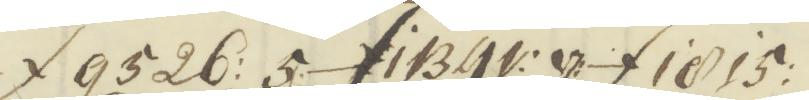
ƒ 9526: 5:—ƒ11341:17: —ƒ1815:
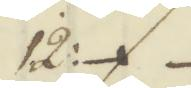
12:—ƒ
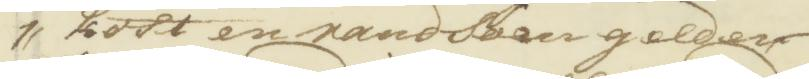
„ kost en randsoen gelden
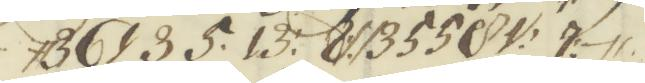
„36135.13: 8:„35581: 7:–„
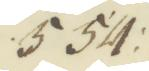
5 54
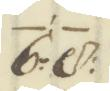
6: 8:
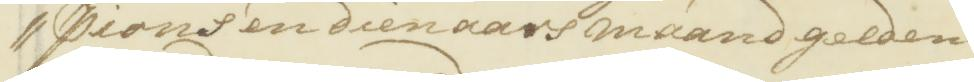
„ Pions en dienaars maand gelden
